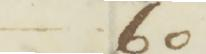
-.60
